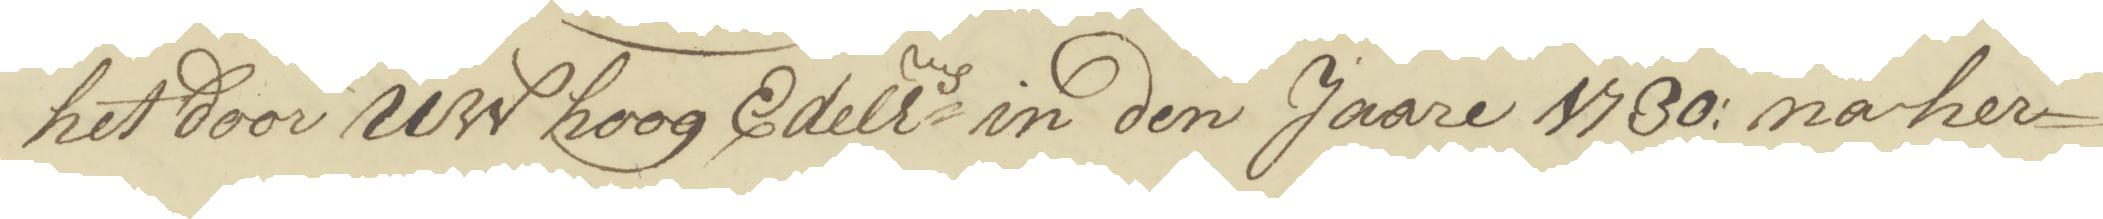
het door uw hoog Edelh=s in den Jaare 1730: na her=
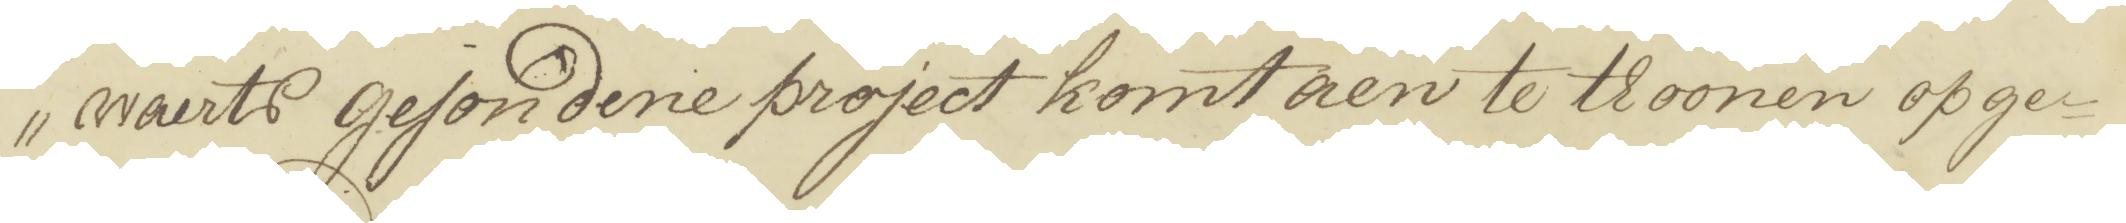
„waerts gesondene project komt aen te thoonen op ge=
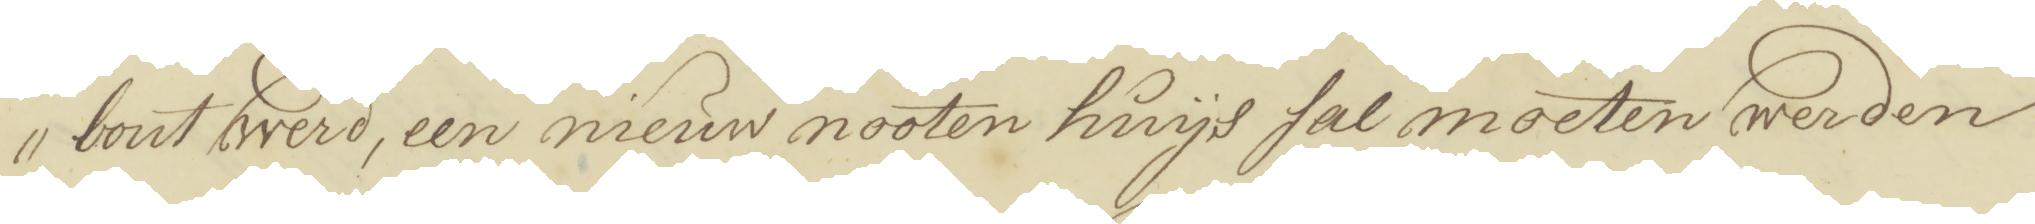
„bout werd, een nieuw nooten huijs sal moeten werden
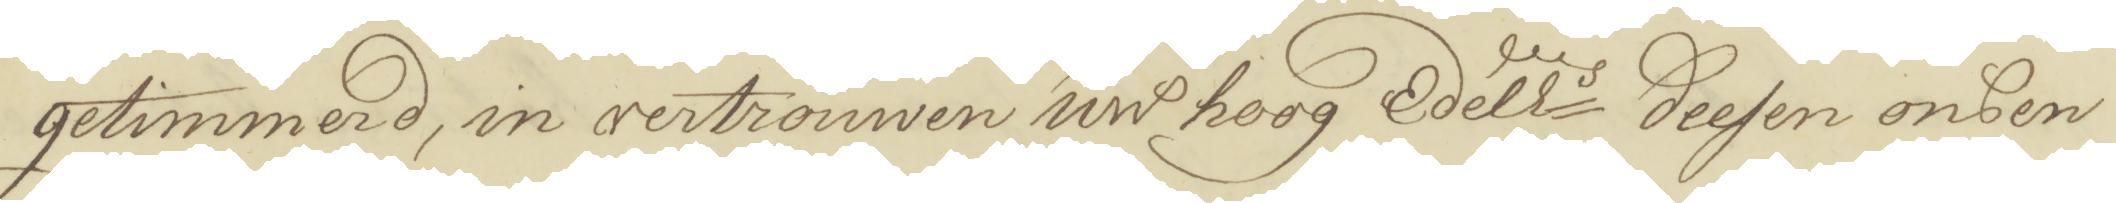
getimmerd, in vertrouwen uw hoog Edelh=s deesen onsen
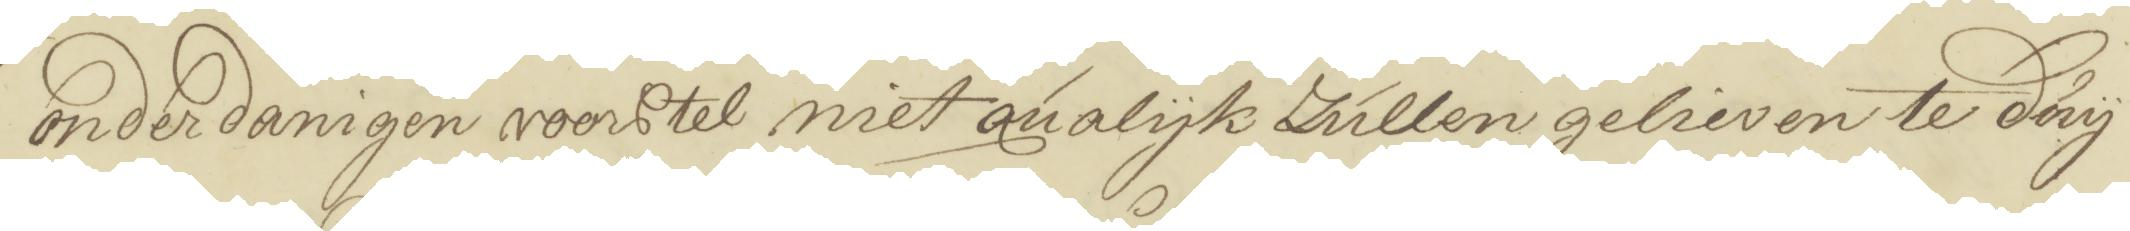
onderdanigen voorstel niet qualijk Zullen gelieven te duij
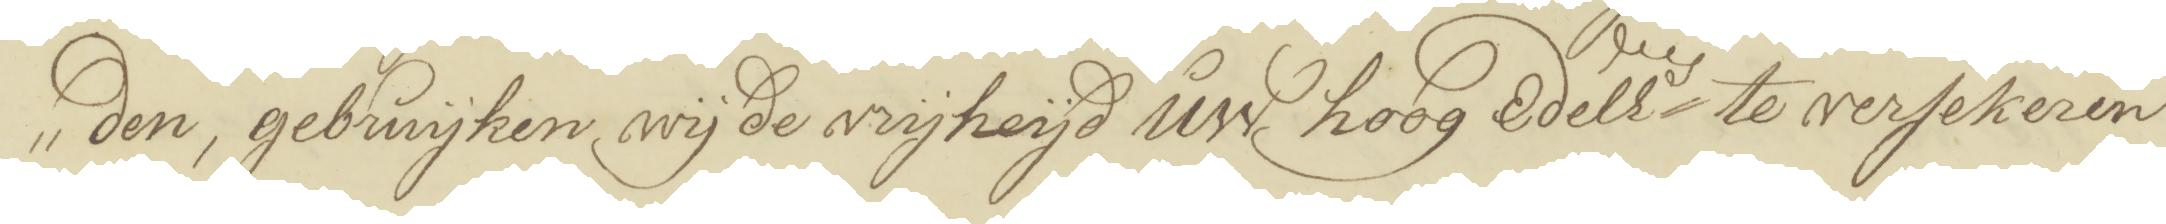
„den, gebruijken wij de vrijheijd UW hoog Edelh=s te versekeren
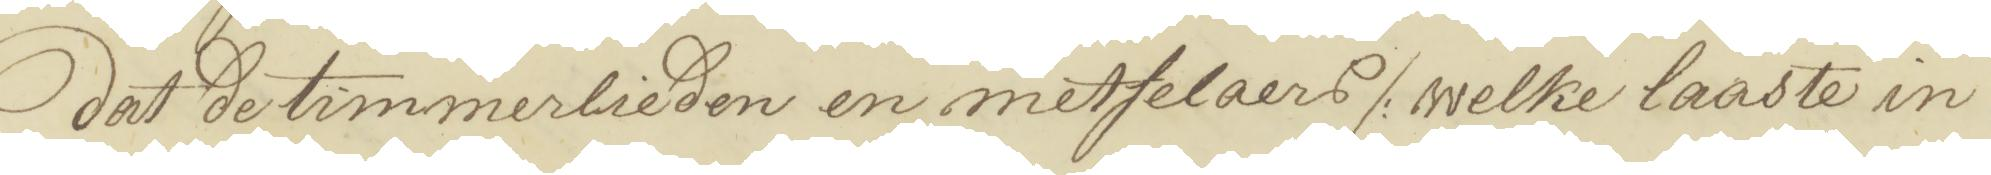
dat de timmerlieden en metselaers /: welke laaste in
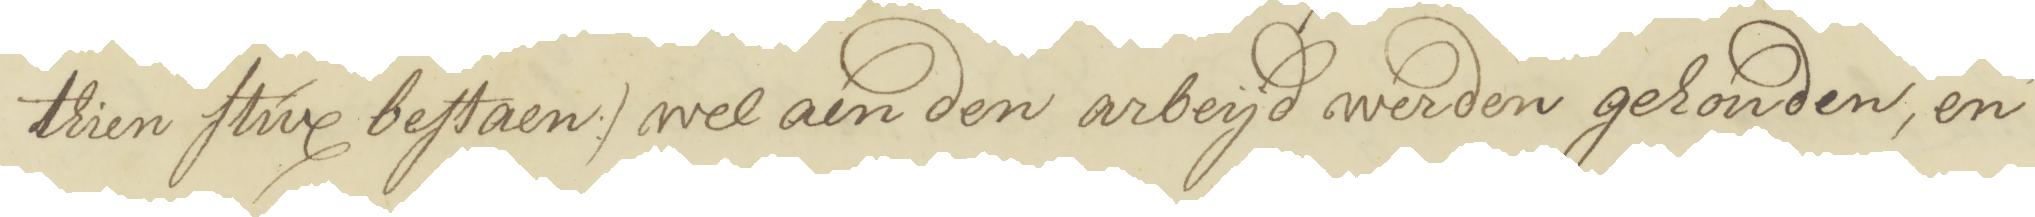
thien stux bestaen :/ wel aen den arbeijd werden gehouden, en
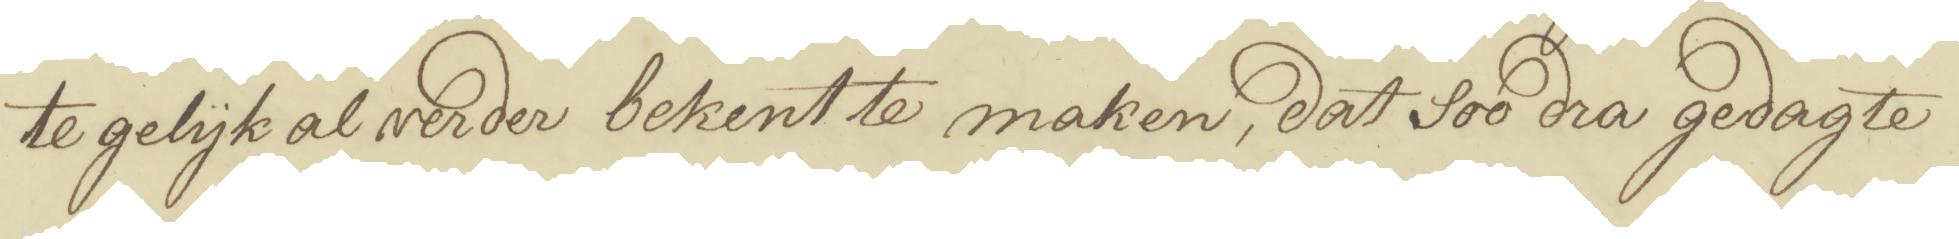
te gelijk al verder bekent te maken, dat soo dra gedagte
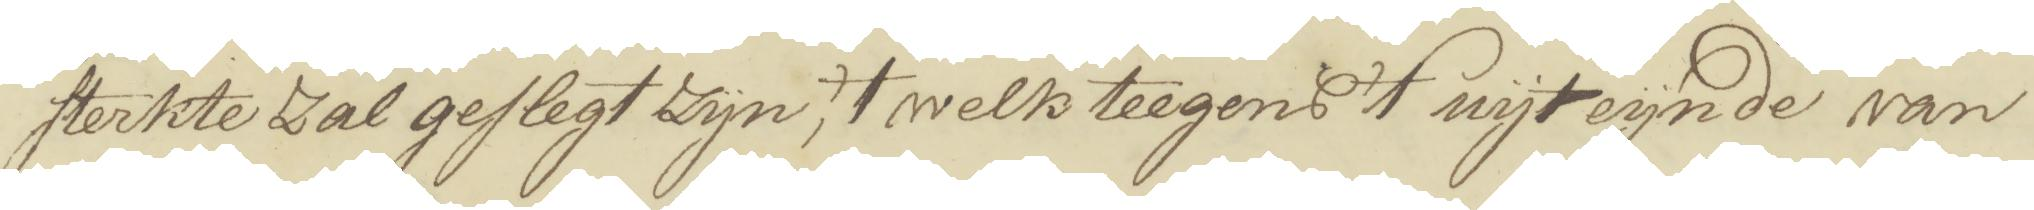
sterkte zal geslegt zijn, ’t welk teegens ’t uijt eijnde van
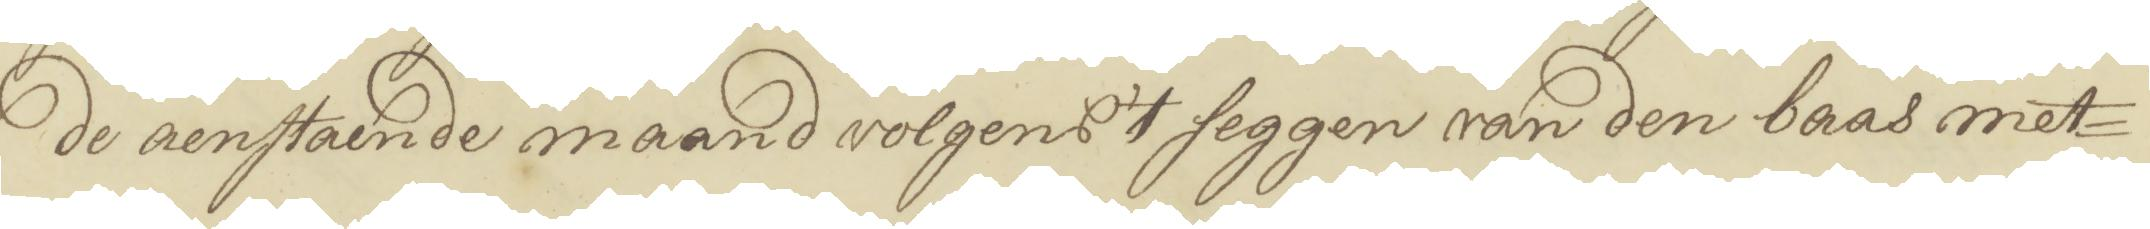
de aenstaende maand volgens ’t seggen van den baas met=
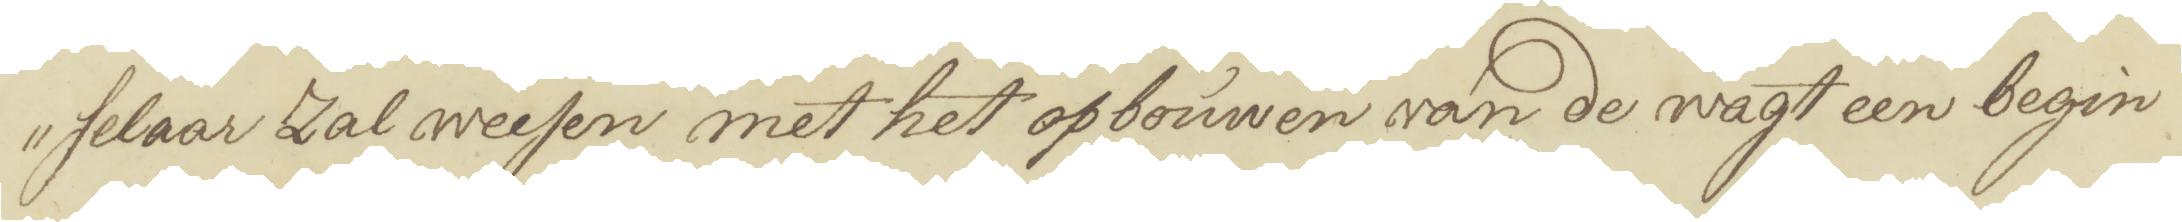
„selaar zal weesen met het opbouwen van de wagt een begin
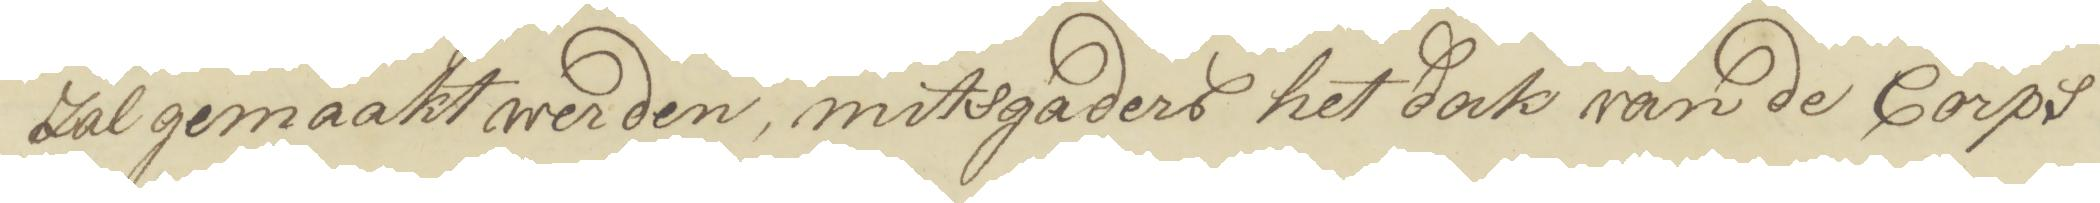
Zal gemaakt werden, mitsgaders het dak van de Corps
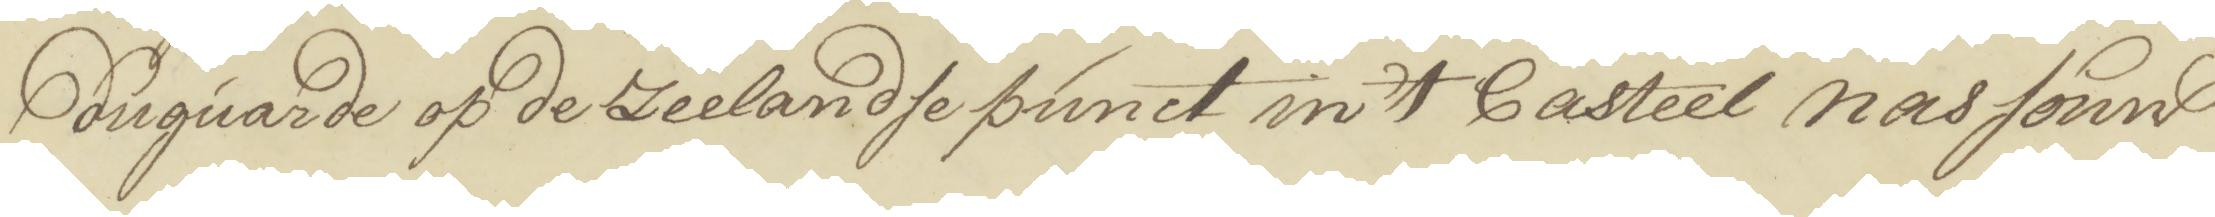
du guarde op de Zeelandse punct in ’t Casteel nassouw
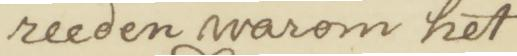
reeden warom het
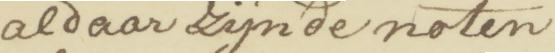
aldaar zijnde noten
